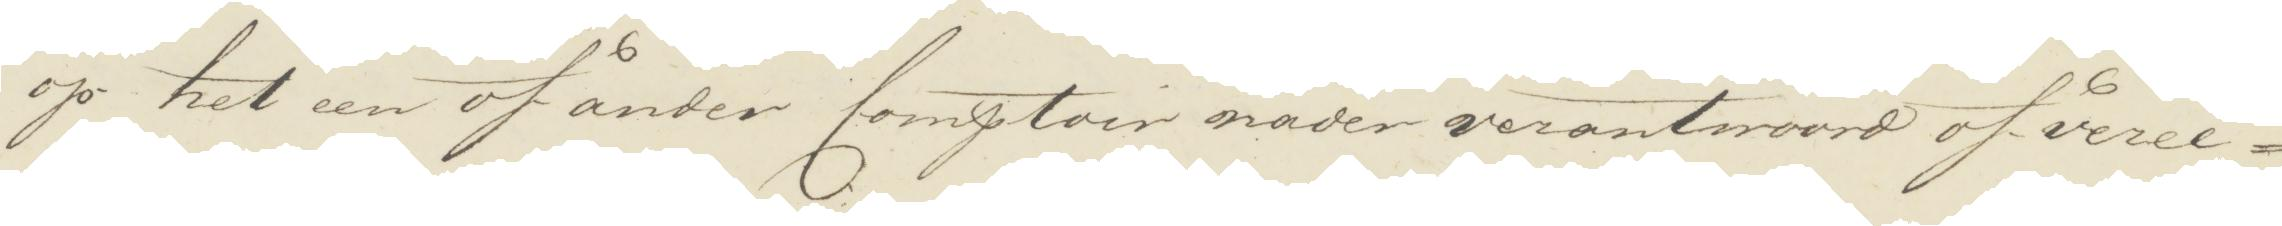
op het een of ander Comptoir nader verantwoord of veree=
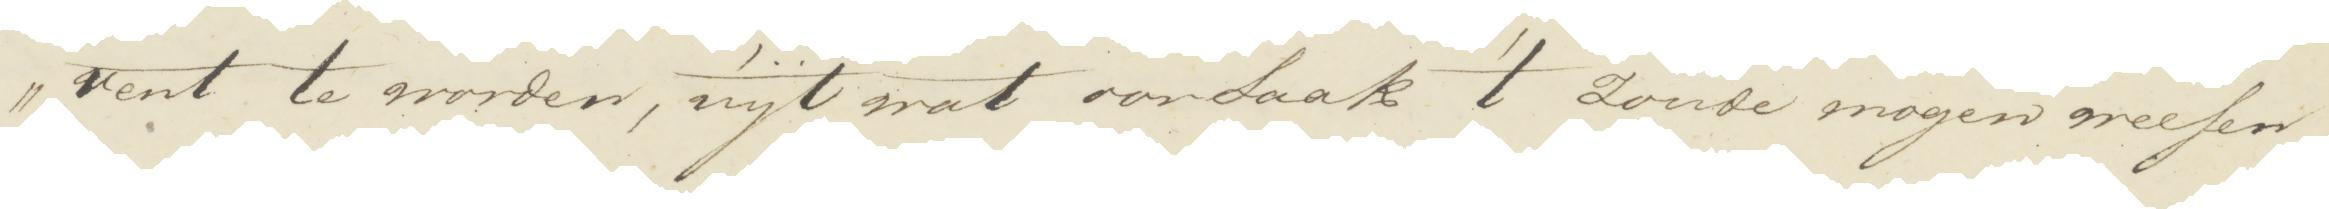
„vent te worden, uijt wat oorsaak ’t zoude mogen weesen,
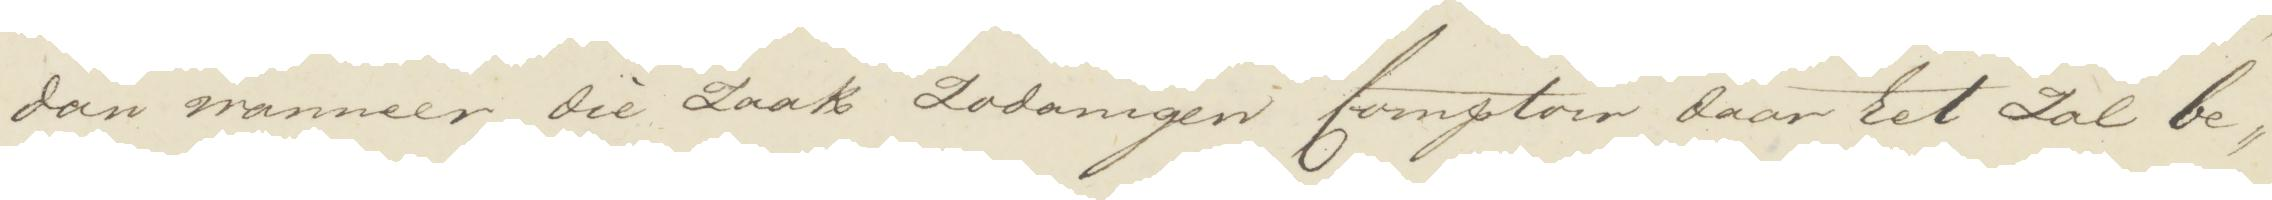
dan wanneer die Zaak zodanigen Comptoir daar het Zal be„
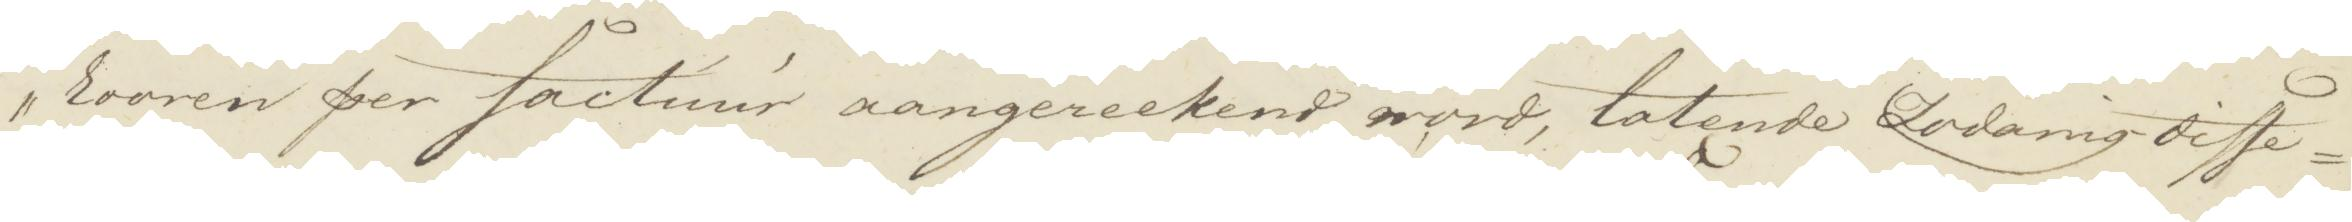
„hooren per factuur aangereekend word, latende Zodanig diffe=
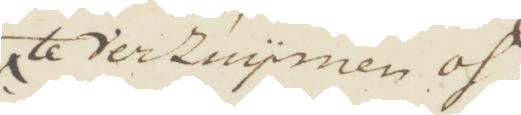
^te verzuijmen of
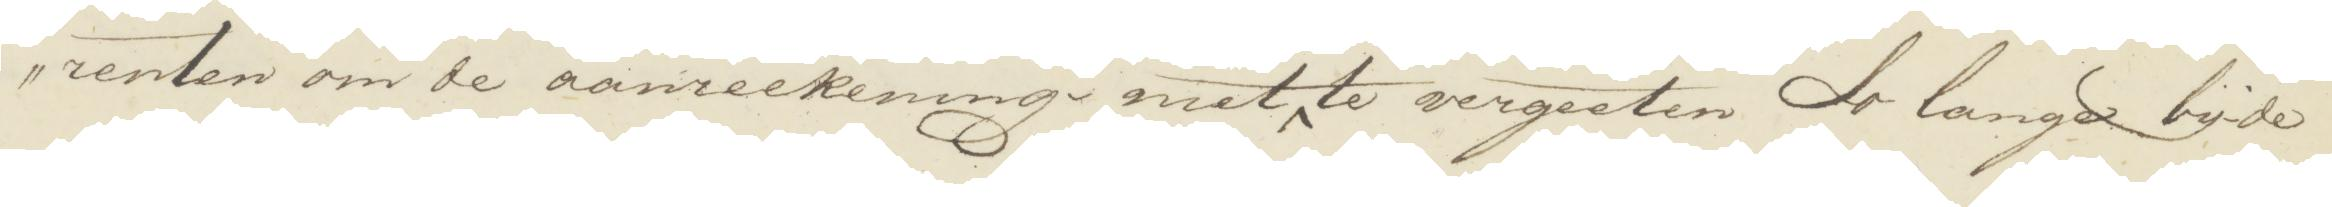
„renten om de aanreekening- niet ^ te vergeeten So lange bij de
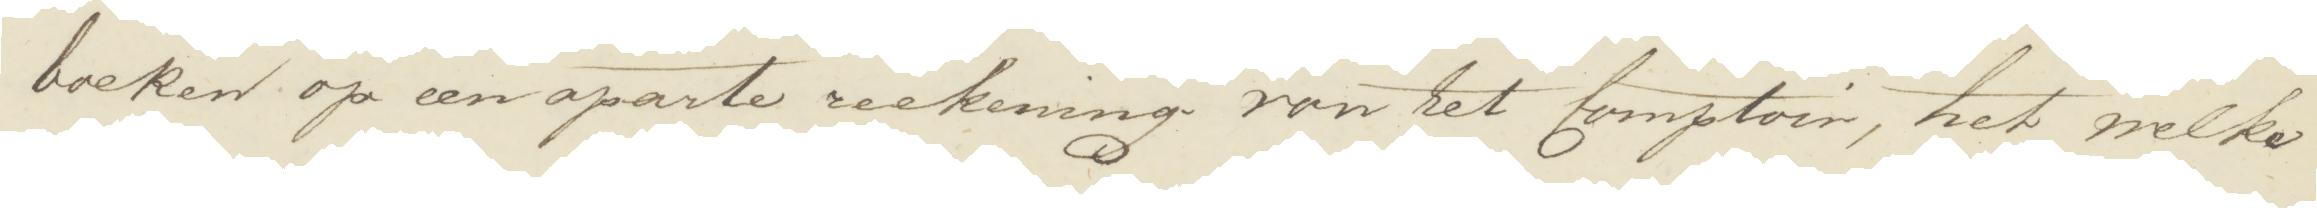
boeken op een aparte reekening- van het Comptoir, het welke
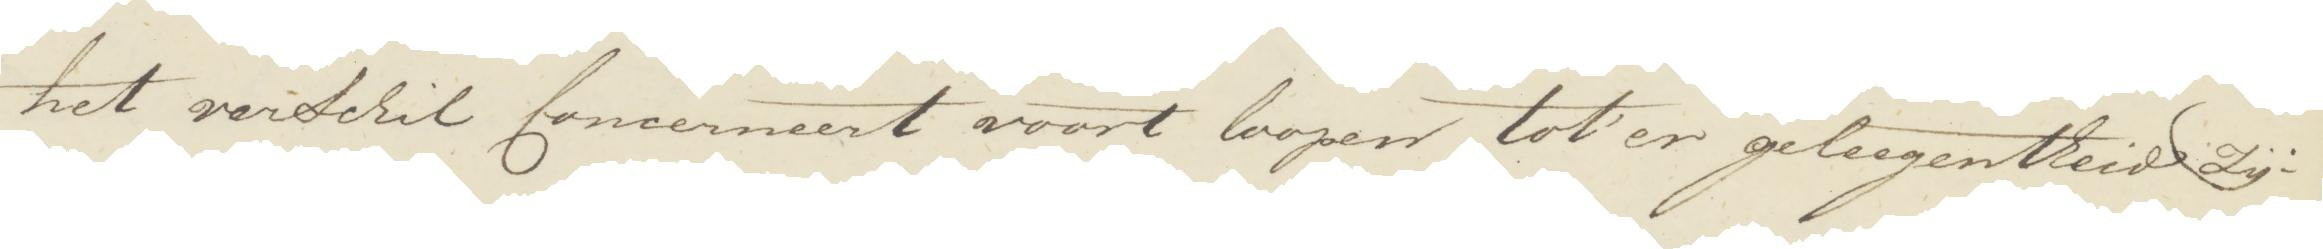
het verschil Concerneert voort loopen, tot er geleegentheid Zij-
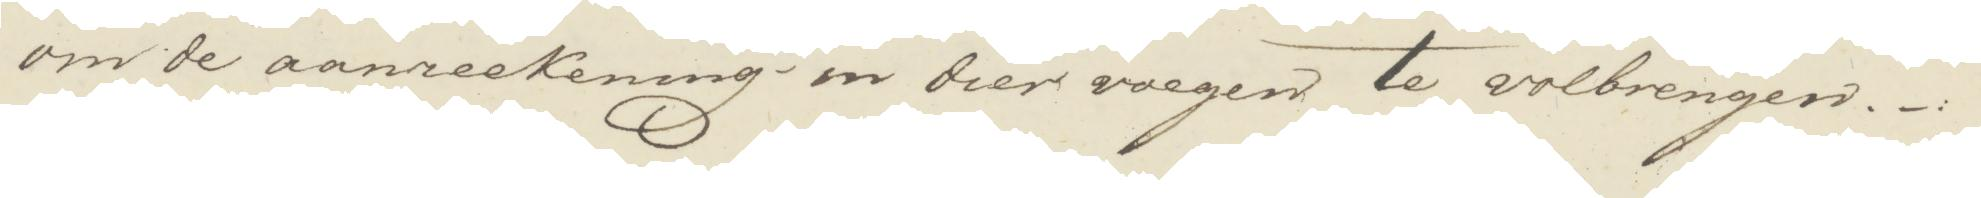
om de aanreekening- in dier voegen te volbrengen._:
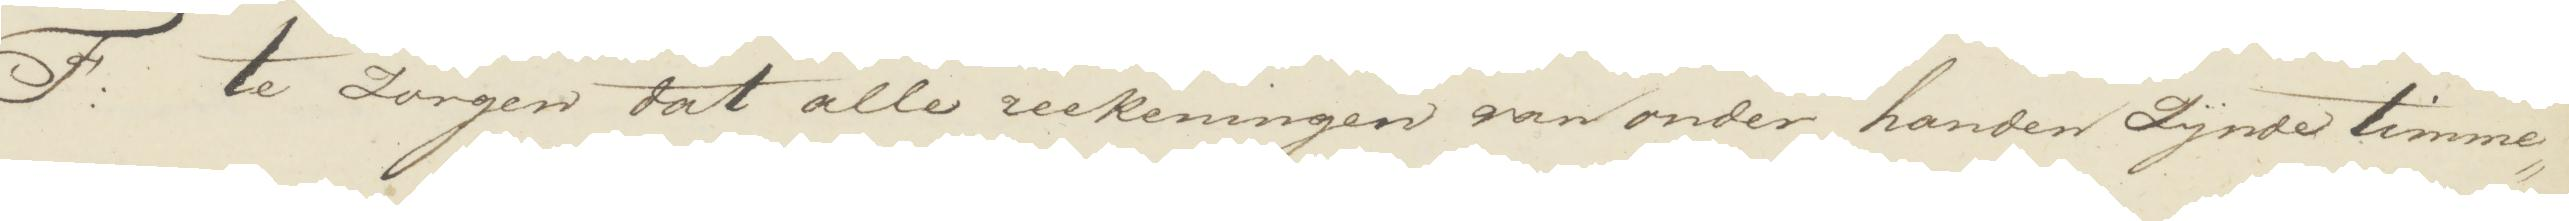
F: te zorgen dat alle reekeningen van onder handen Zijnde timme„
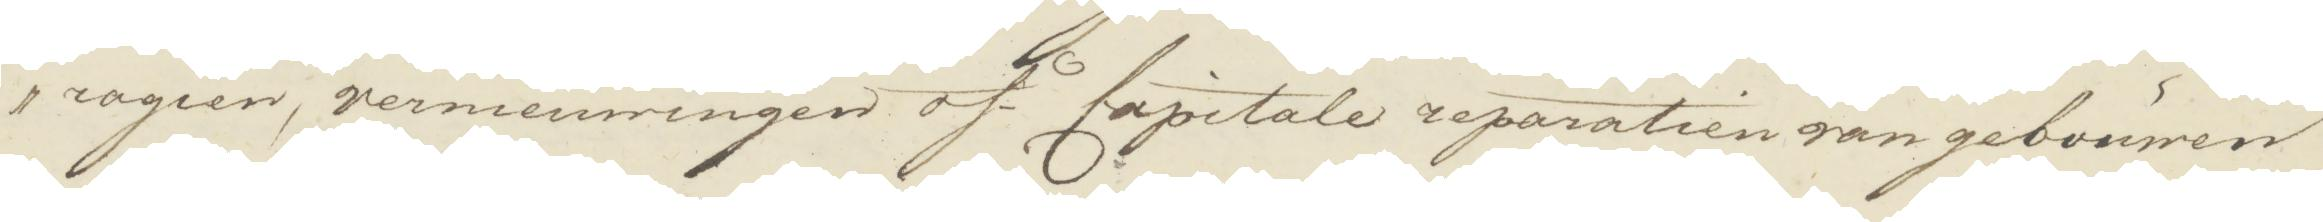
„ragien, vernieuwingen of Capitale reparatien van gebouwen
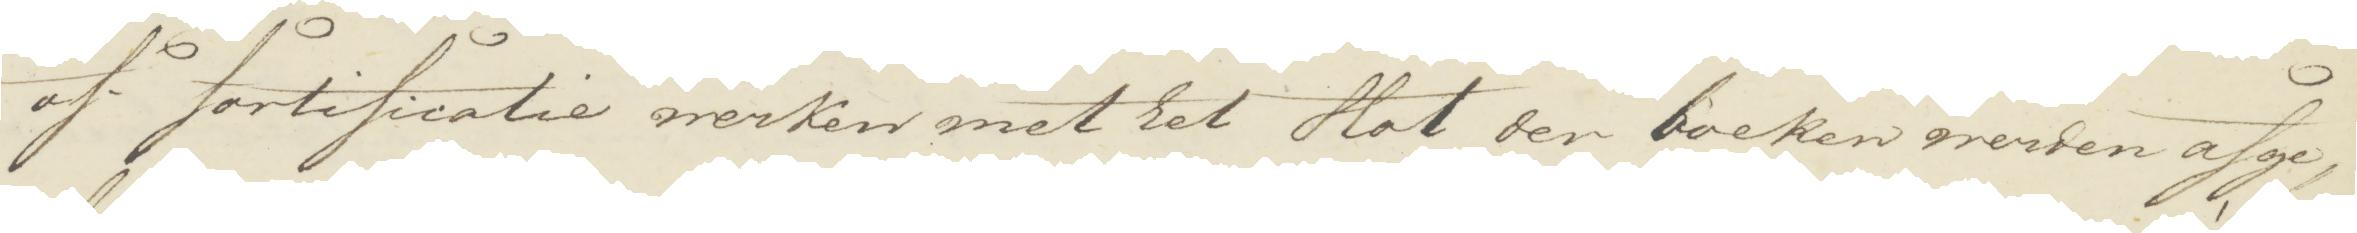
of fortificatie werken met het Slot der boeken werden afge„
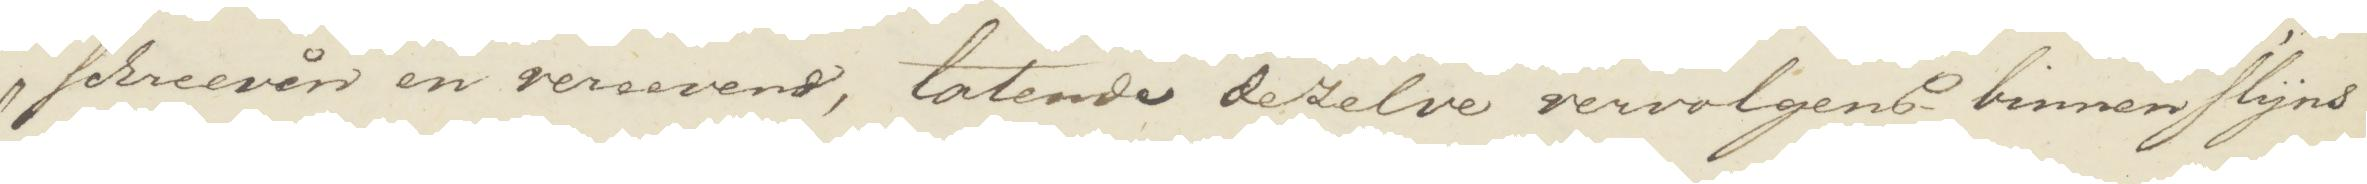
„schreeven en vereevend, latende dezelve vervolgens binnen s'lijns
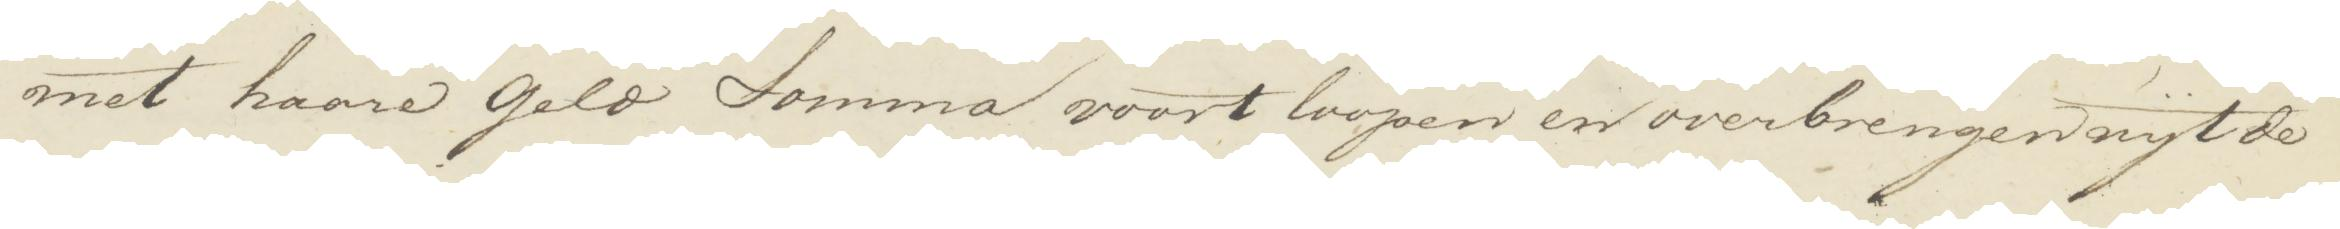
met haare geld Somma voort loopen en overbrengen uyt de
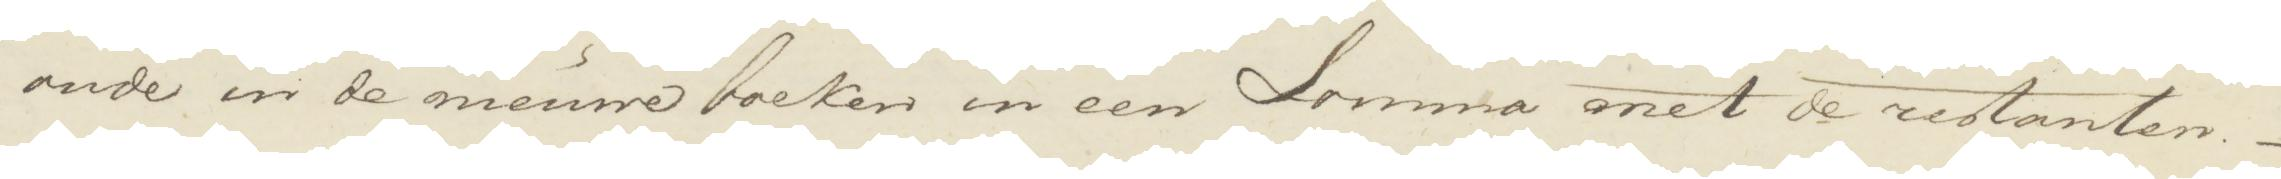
oude in de nieuwe boeken in een Somma met de restanten._
